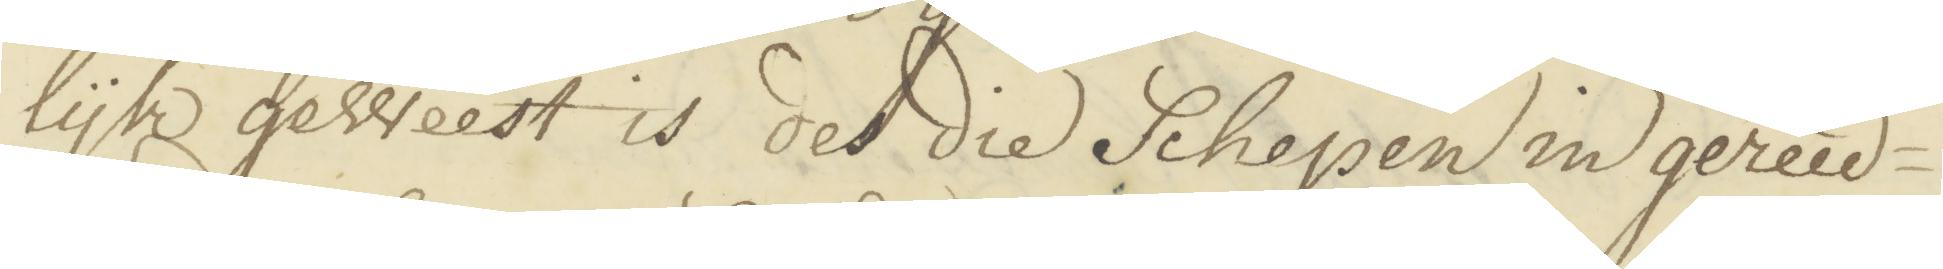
lijk gesweest is des die Schepen in gereed=
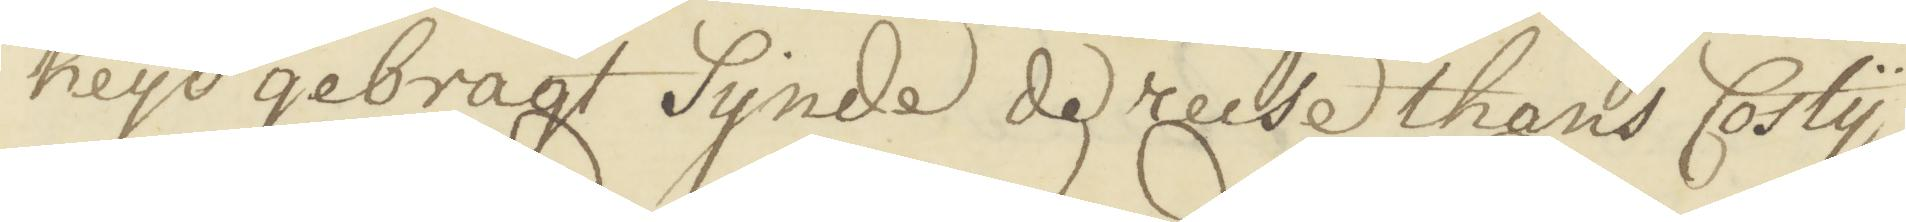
nejt gebragt Sijnde de reise thans Costij
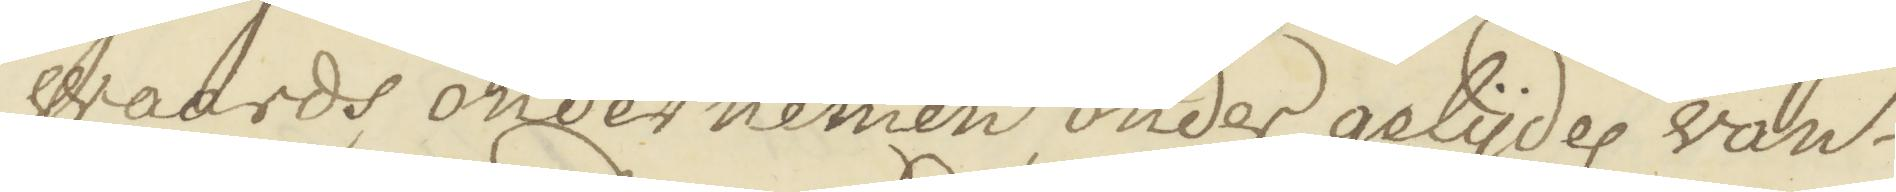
waards ondernemen onder gelijde van
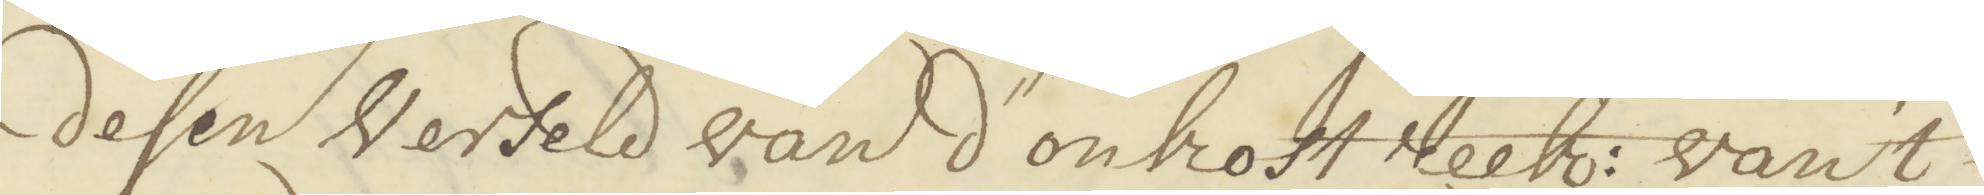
desen Verseld van d’ onkost reek: van ’t
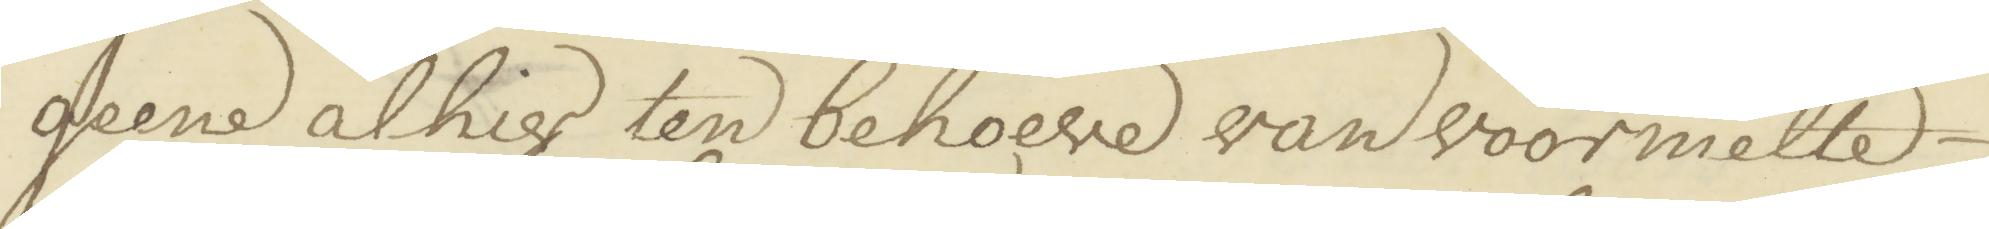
geene alhier ten behoeve van voormelte
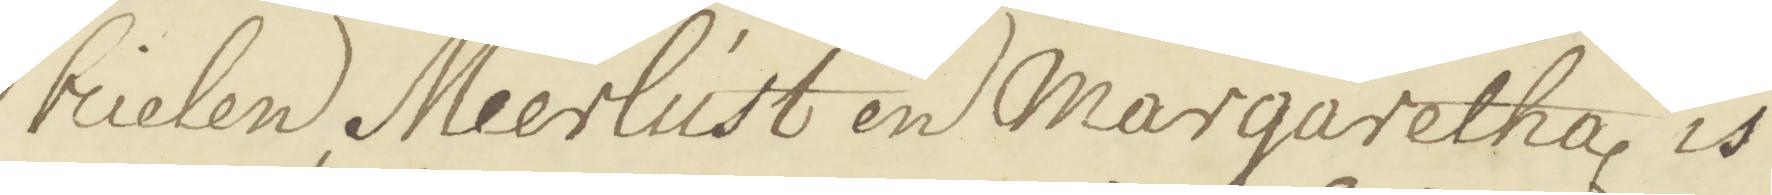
kielen Meerlust en Margaretha is
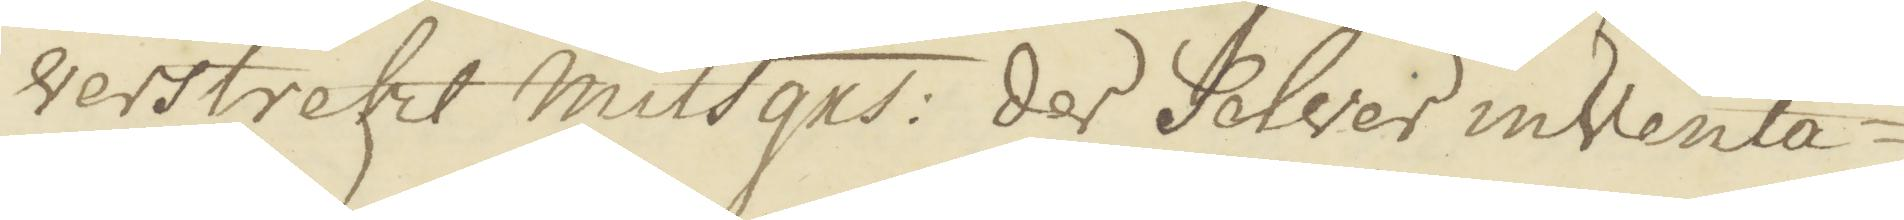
verstrekt mitsgrs: der Selver inventa=
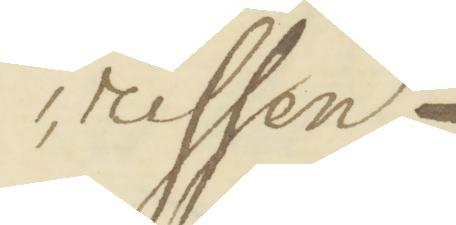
„rissen
